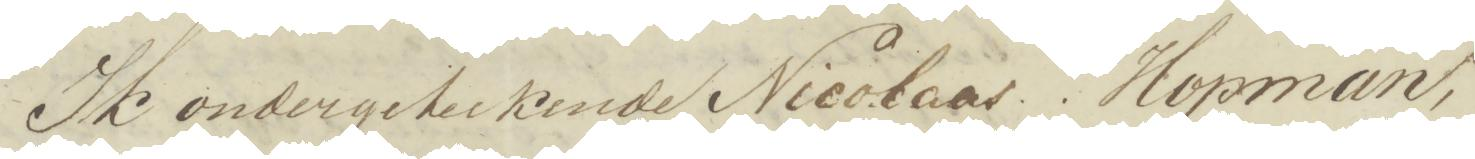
Jk ondergeteekende Nicolaas Hopman,
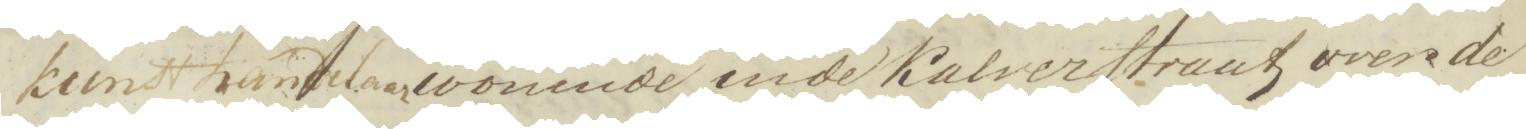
kunsthandelaar wonende inde Kalverstraat over de
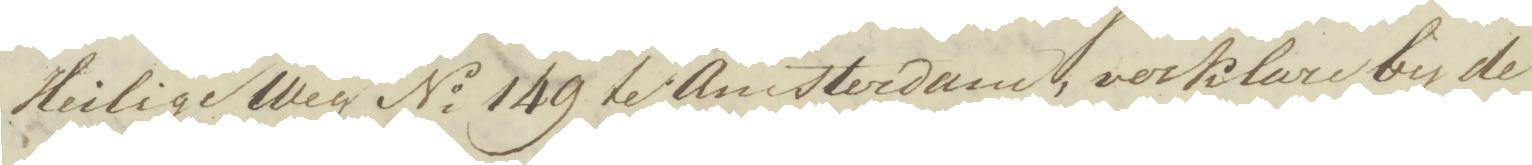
Heilige Weg N=o 149 te Amsterdam, verklare by de
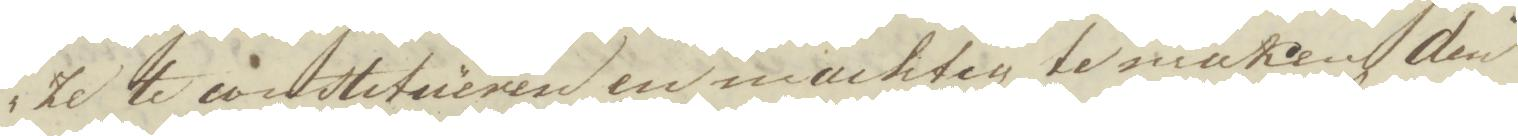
„ze te costitueren en machtig te maken den
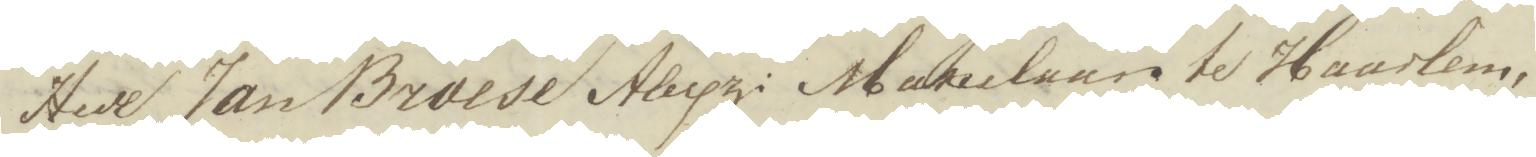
Heer Jan Broese Alexz: Makeelaar te Haarlem,
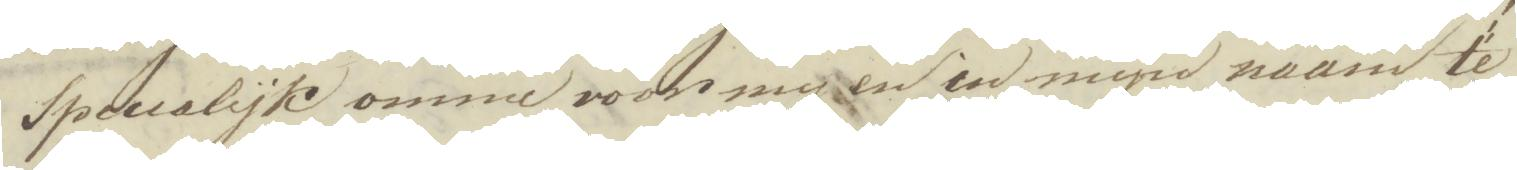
Specialijk omme voor my en in mijne naam te
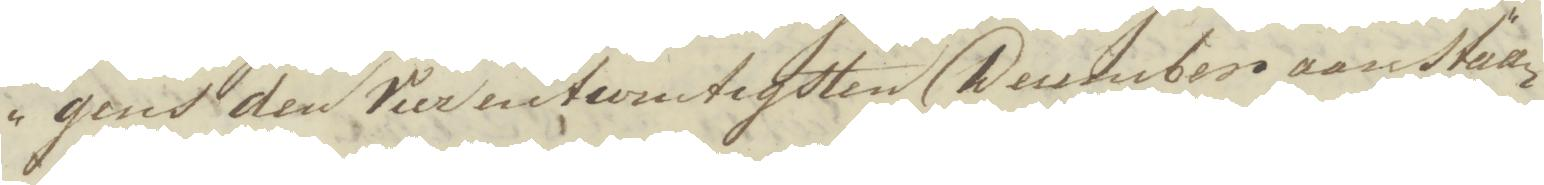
„gens den Vier en twintigsten December aanstaan
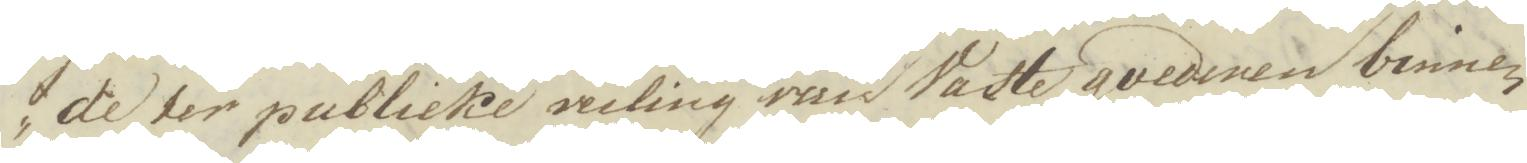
„de ter publieke veiling van Vaste goederen binnen
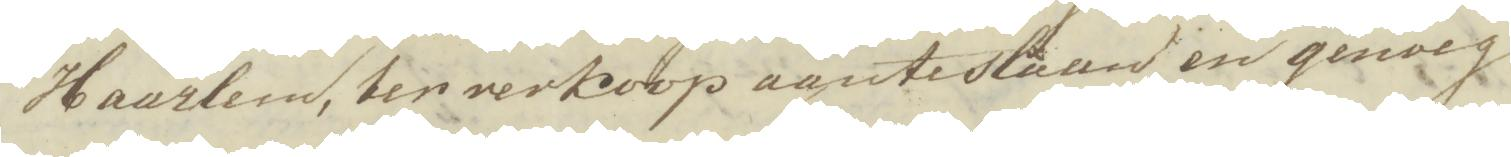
Haarlem, ter verkoop aanteslaan en genoeg
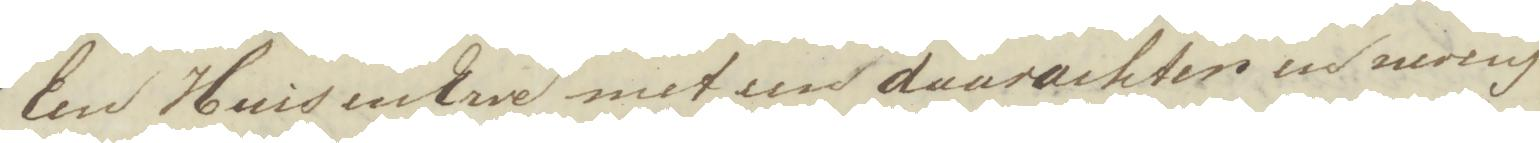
Een Huis en Erve met een daarachter en nevens
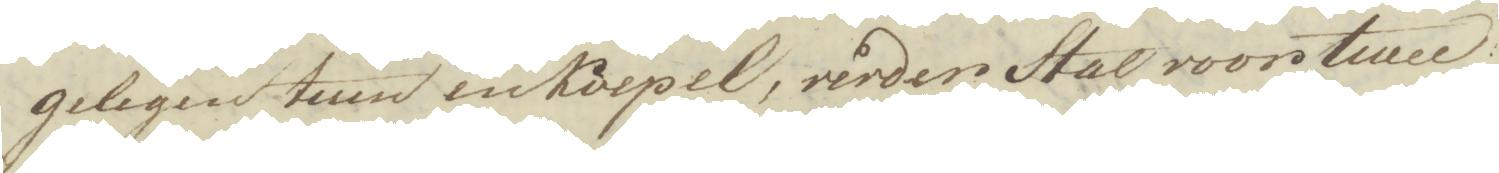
gelegen tuin en koepel, verder Stal voor twee
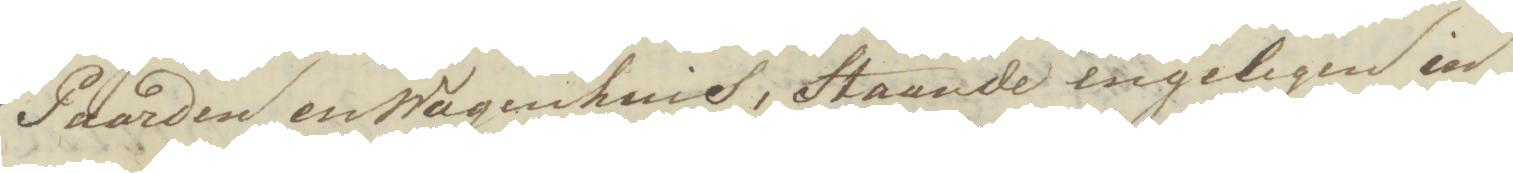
Paarden en Wagenhuis, Staande en gelegen in
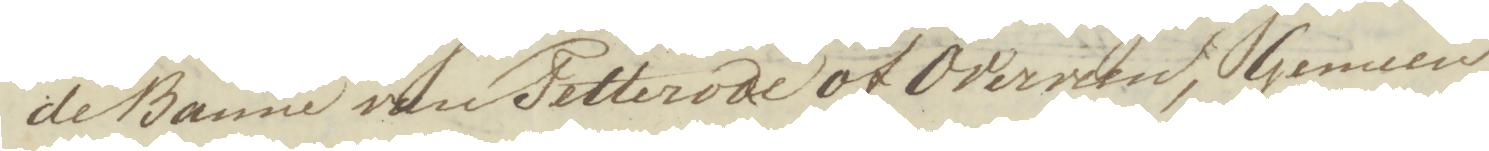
de Banne van Tetterode of Overveen, Gemeen
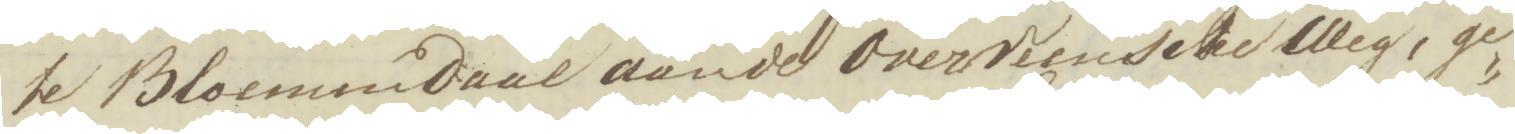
te Bloemendaal aan de Overveensche Weg, ge„
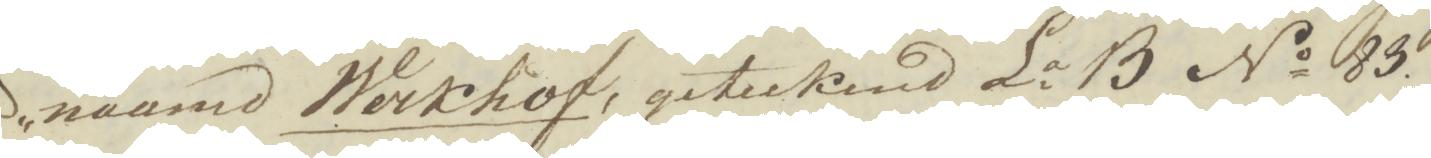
„naamd Werkhof, geteekend L=a B N=o 83.
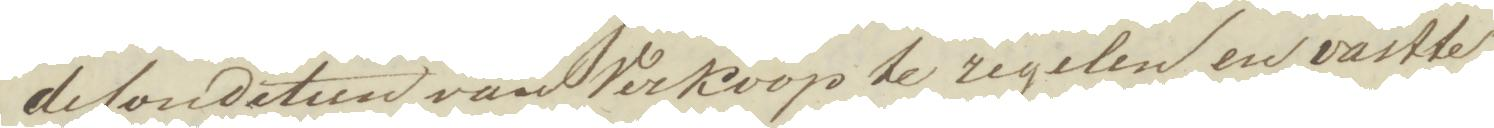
de Conditien van Verkoop te regelen en vastte
